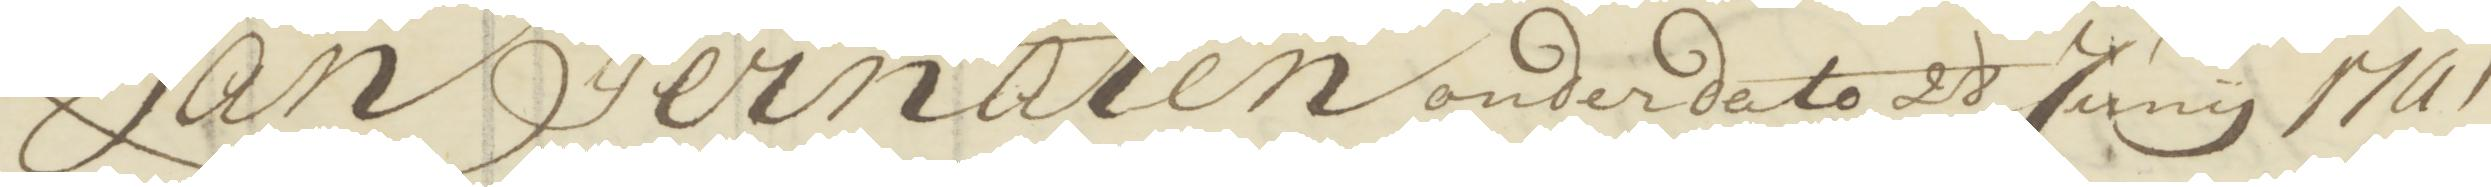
Van Ternaten onder dato 28 Junij 1741
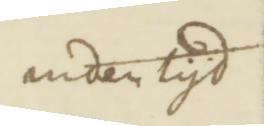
inden tijd
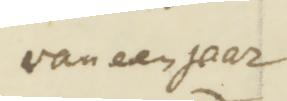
van een jaar
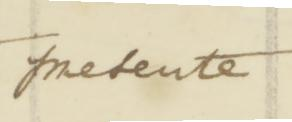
presente
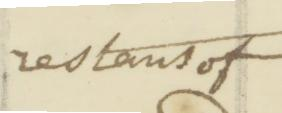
restans of
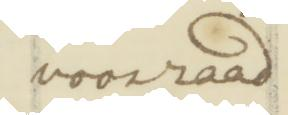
voorraad
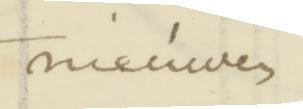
nieuwen
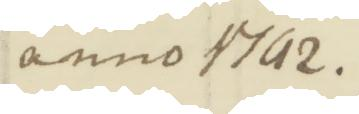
anno 1742.
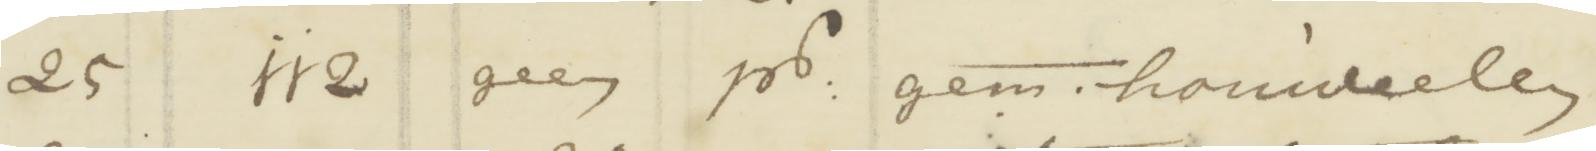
25 112 geen p:s gem. houweelen
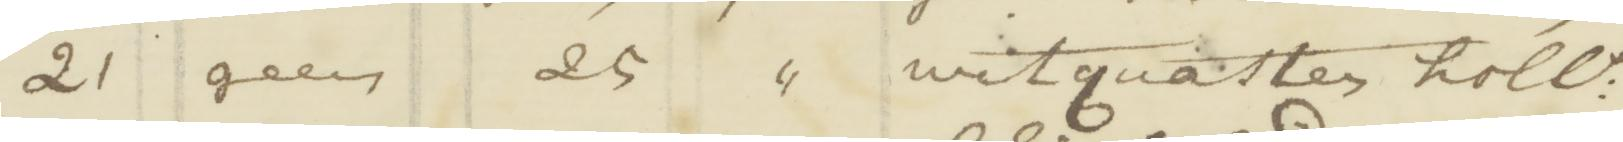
21 geen 25 „ witquasten holl:s
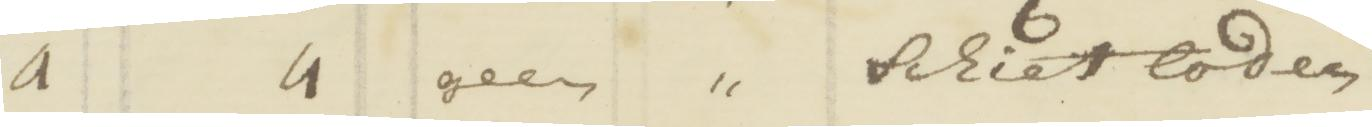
4 4 geen „ schietloden
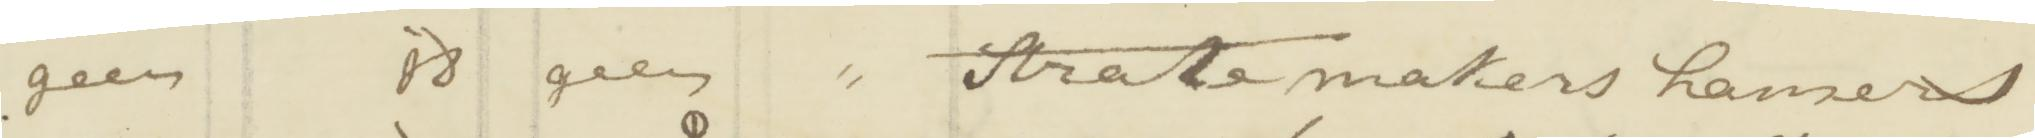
geen 18 geen „ stratemakers hamers
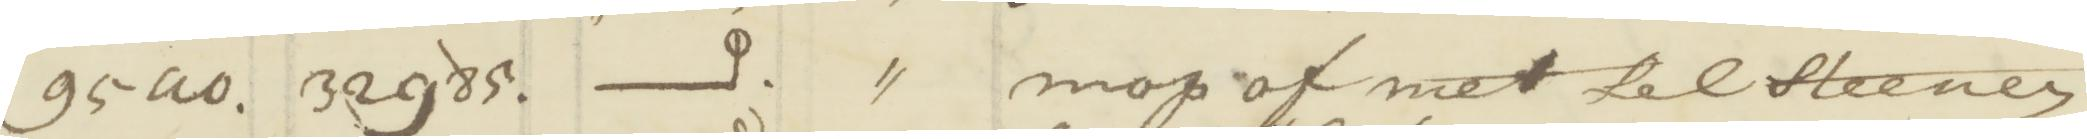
9540. 32985. _.o „ mop of metzelsteenen
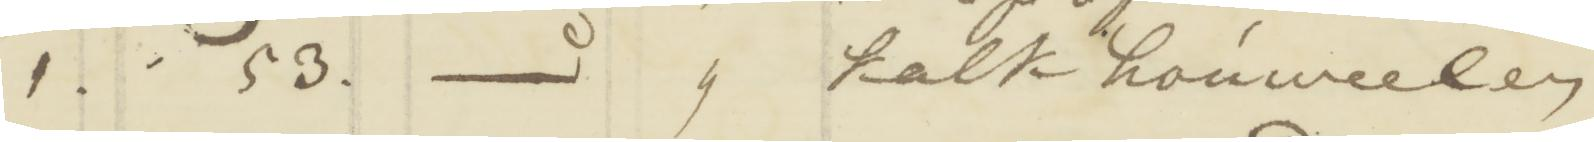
1. 53. _o kalk houweelen
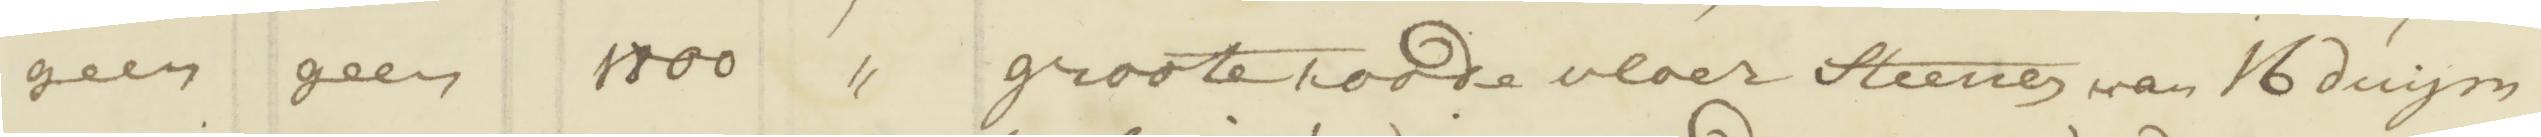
geen geen 1800 „ groote roode vloer steenen van 16 duijm
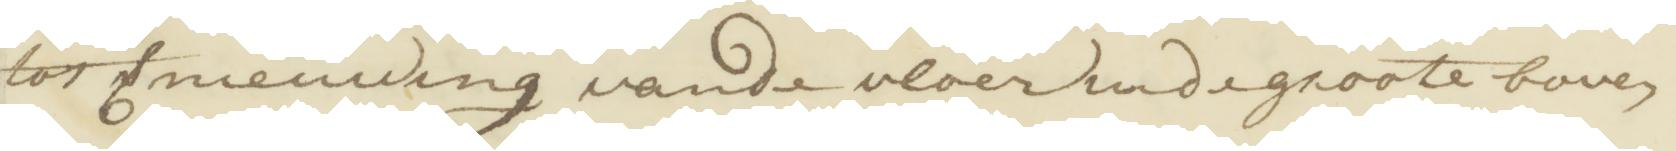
tot vernieuwing vande vloer in de groote boven
